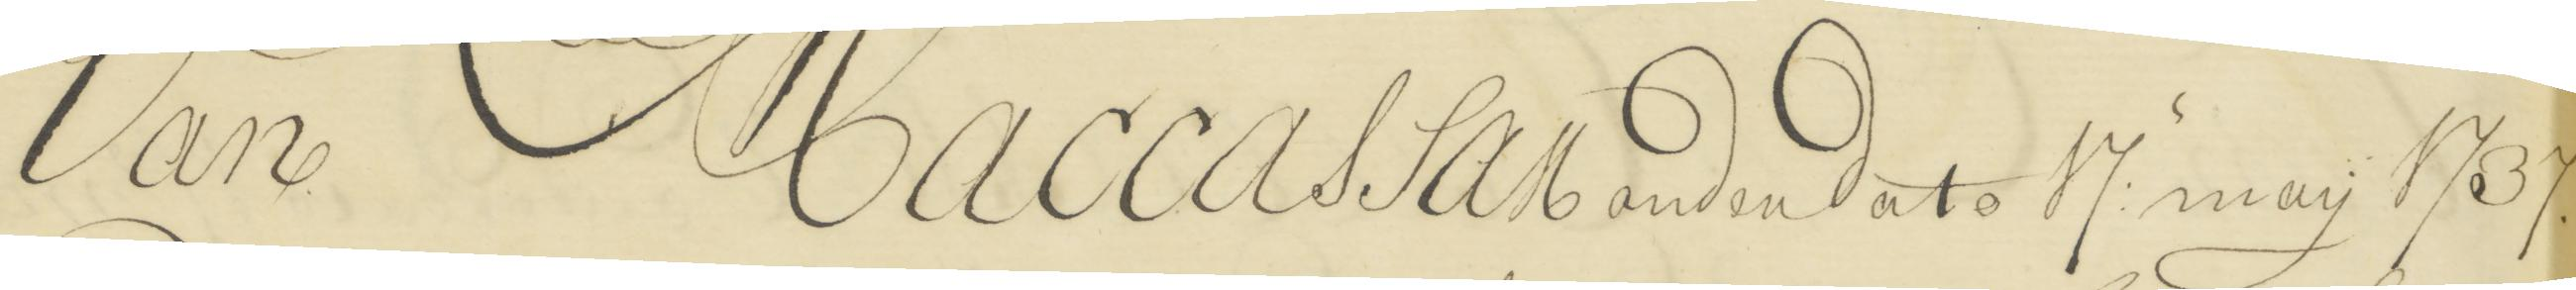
Van Maccassar onder dato 17:' maij 1737.
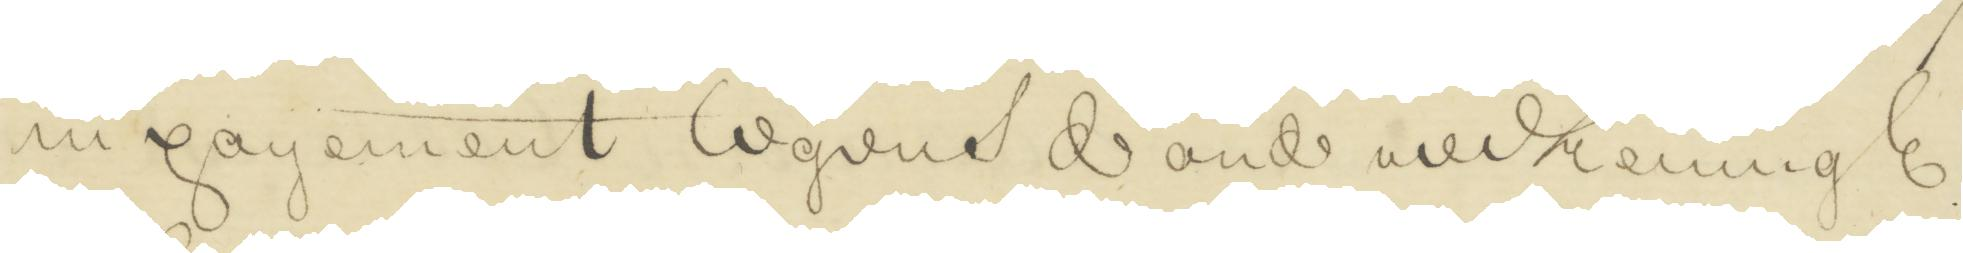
in paijement tegens de oude reekeningh
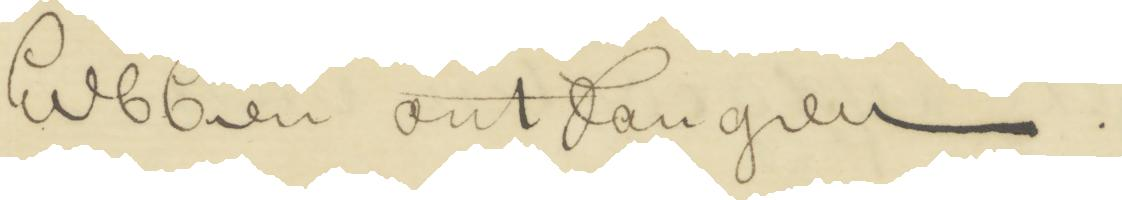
hebben ontfangen.
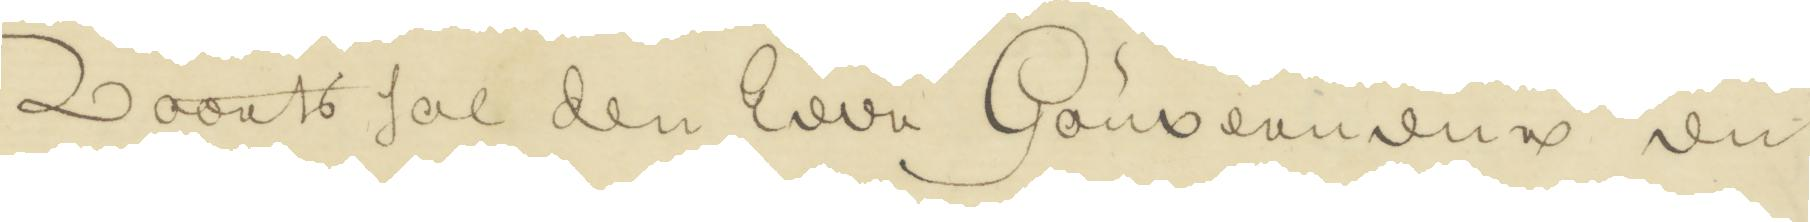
Voorts sal den heer Gouverneur en
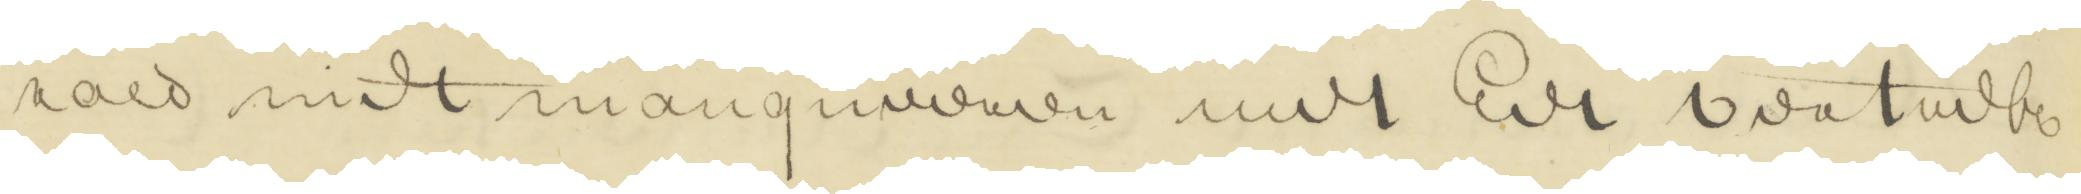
raed niet manqueeren met het vertrek
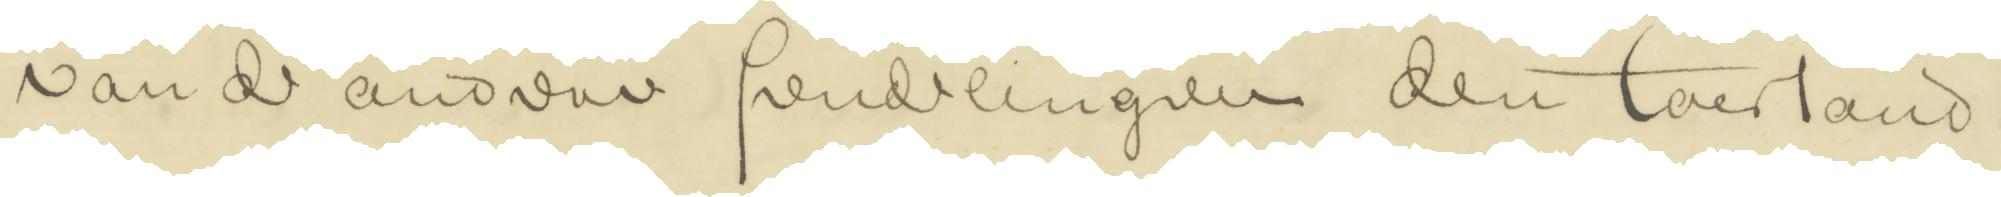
van de andere sendelingen den toestand
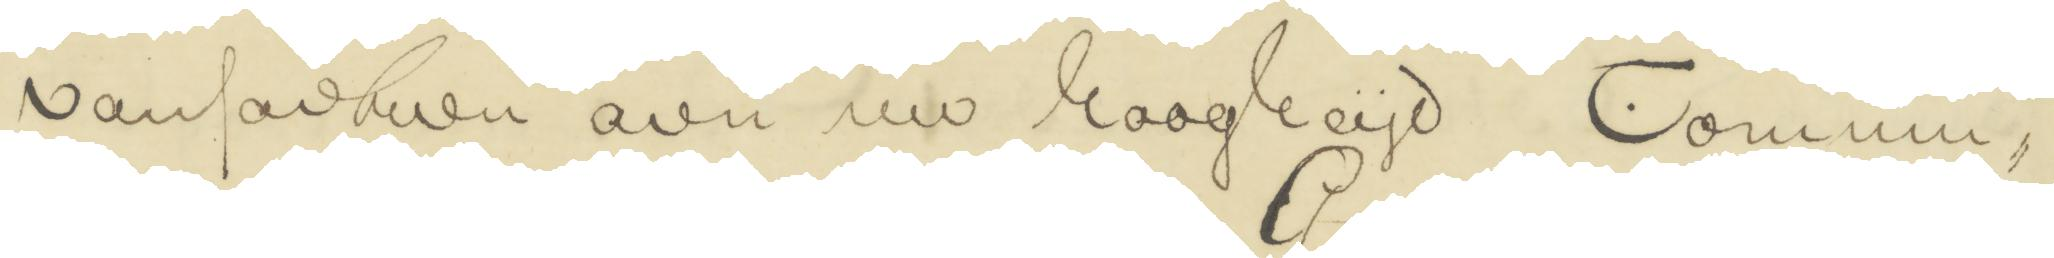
van saeken aen uw hoogheijd Commu„
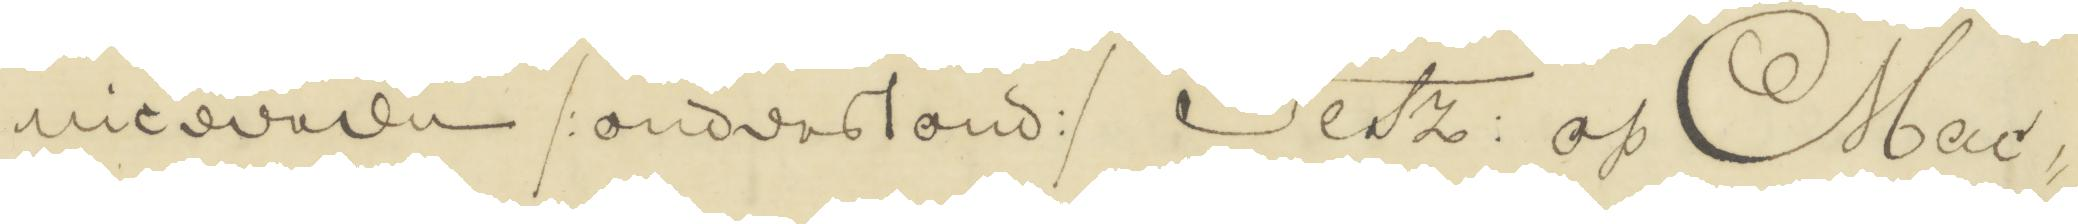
niceeren /:onderstond:/ Gesz: op Mac„
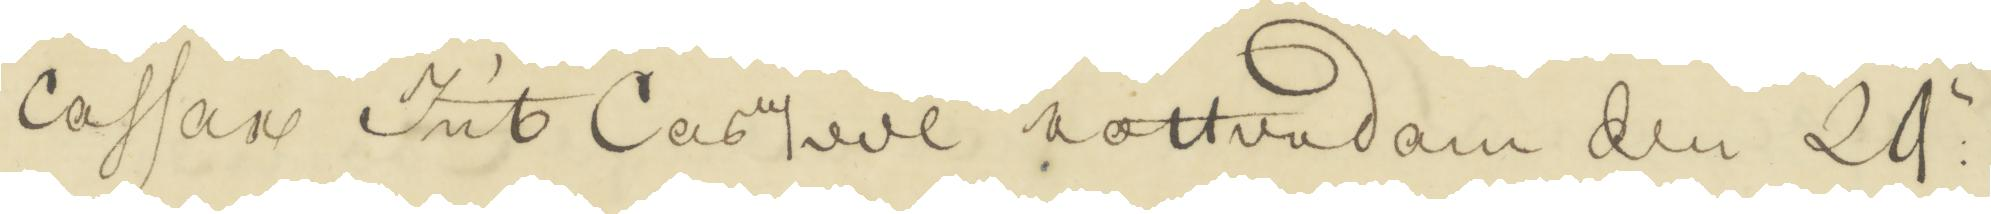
cassar In't Casteel rotterdam den 24:'
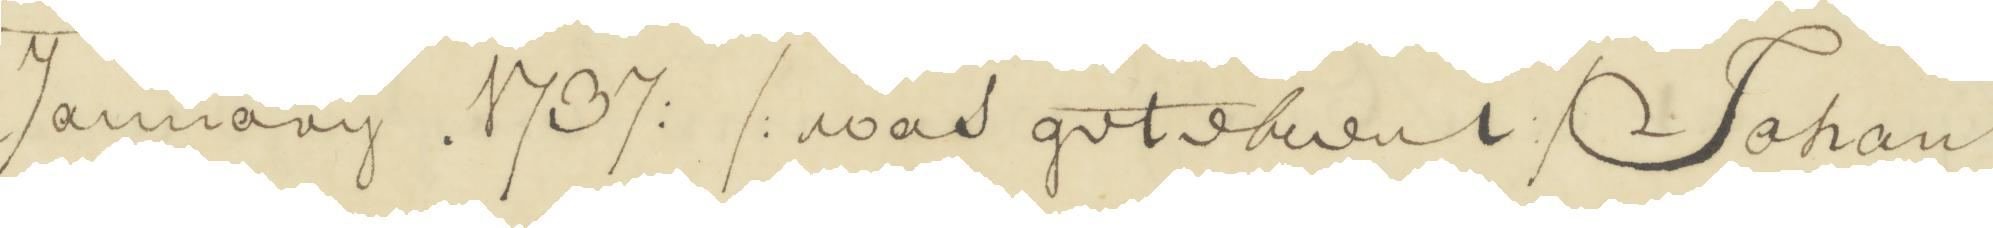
Januarij 1737: /:was getekent:/ Johan
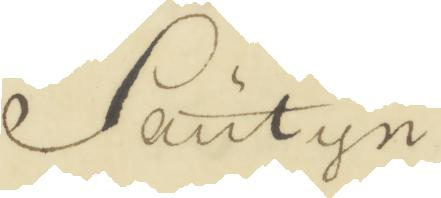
Sautijn
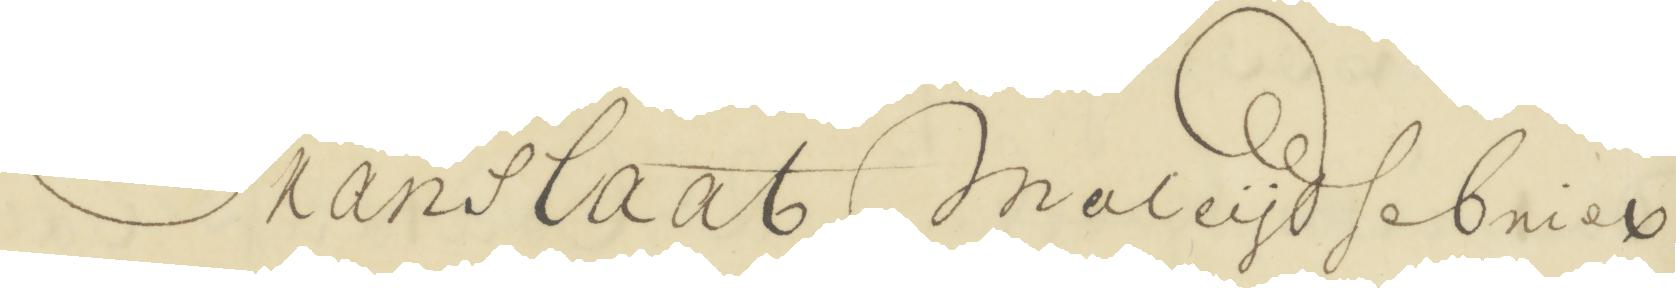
Translaat maleijdse briev
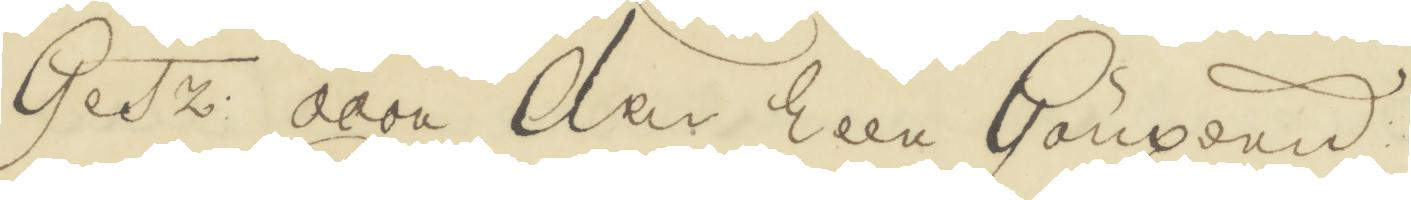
Gesz: door den heer Gouvern:
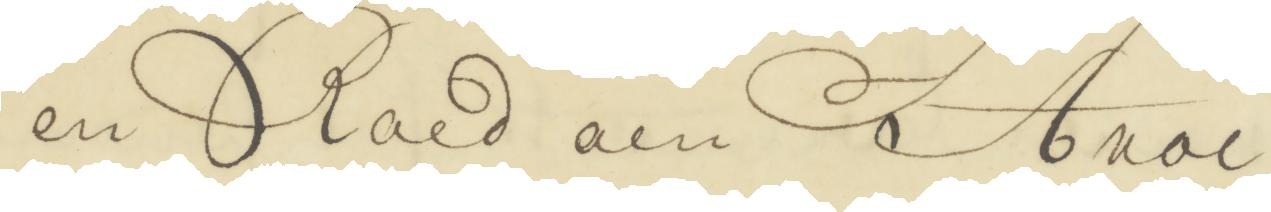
en Raed aen Aroe
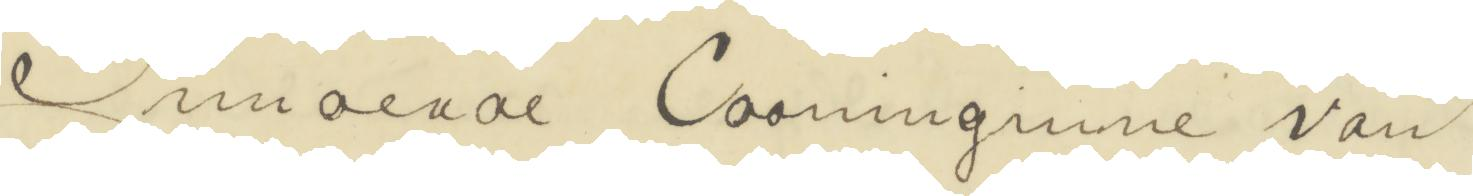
Timoeroe Cooninginne van
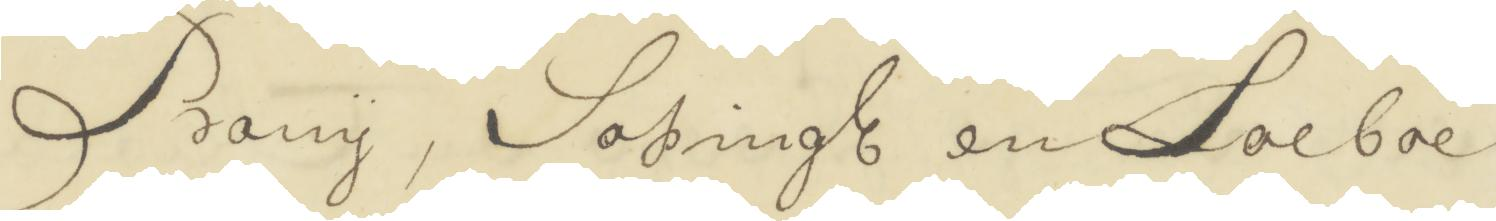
Bonij, Sopingh en Loeboe
